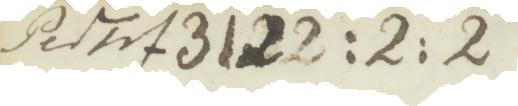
Per Trƒ3122 :2: 2
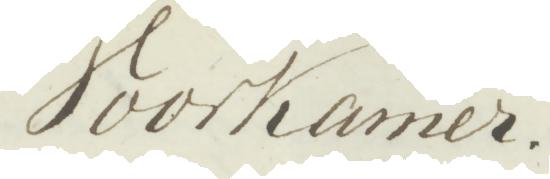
Voorkamer.
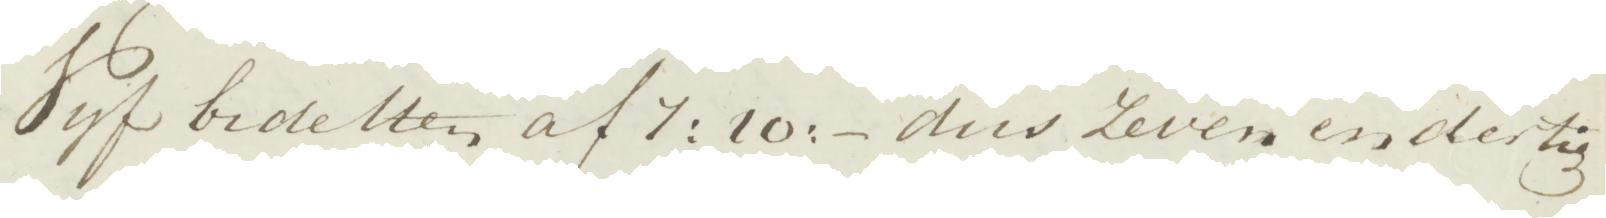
Vyf bidetten aƒ 7: 10:—dus zeven en dertig
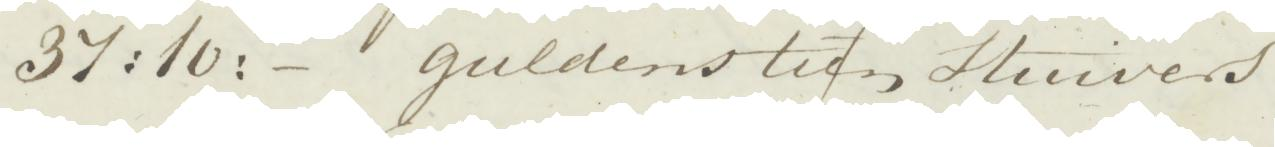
37:10:— guldens tien stuivers
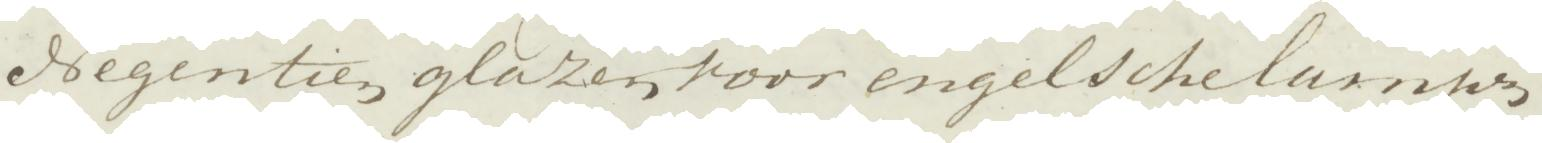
Negentien glazen voor engelsche lampen
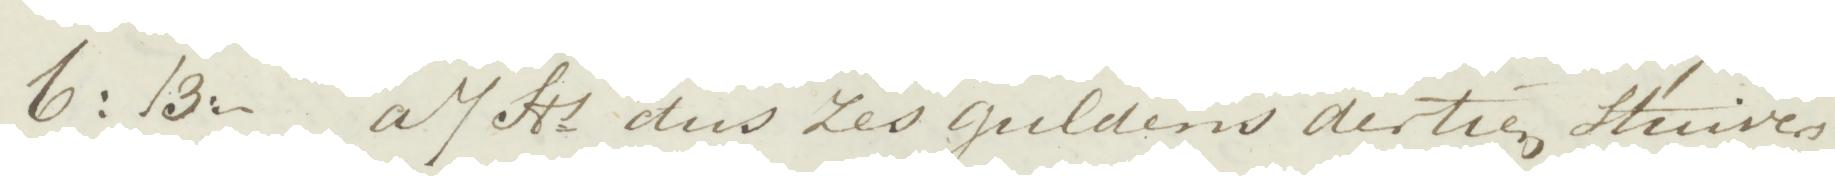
6: 13:- a7 st=s dus zes guldens dertien stuivers
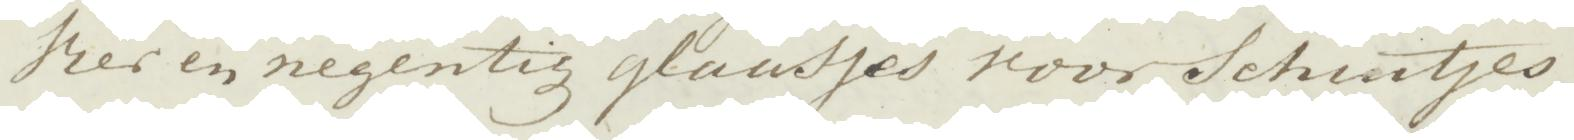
Vier en negentig glaasjes voor schuitjes
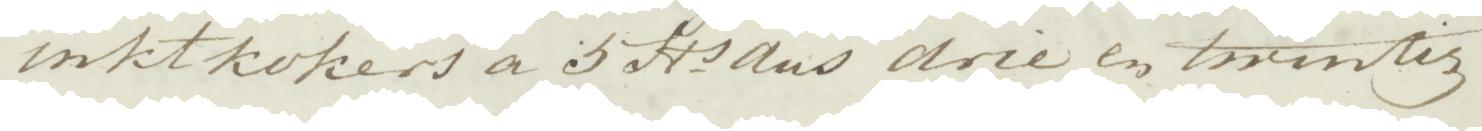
inktkokers a 5 st-s dus drie en twintig
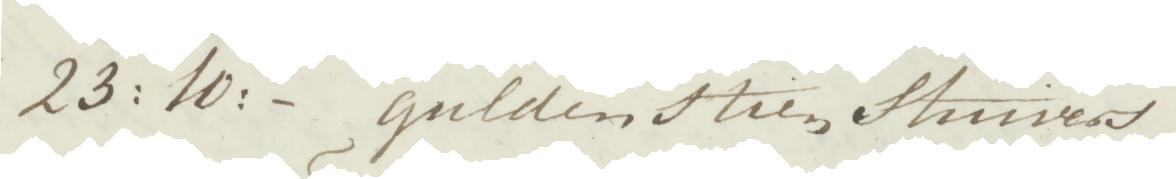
23: 10: - guldens tien stuivers
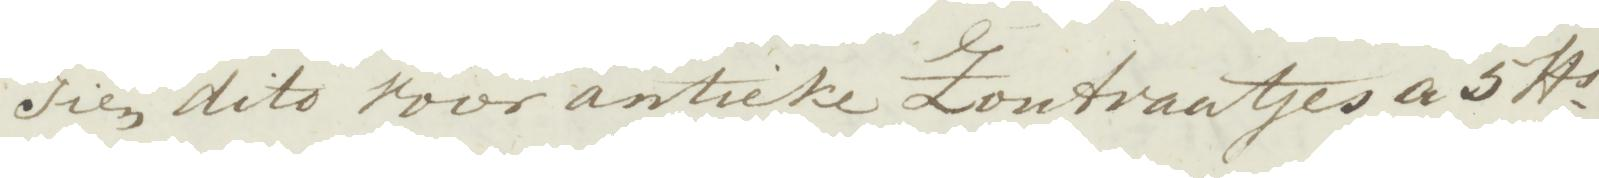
Tien dito voor antieke Zoutvaatjes a 5 st-s
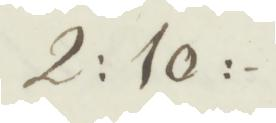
2: 10 :-
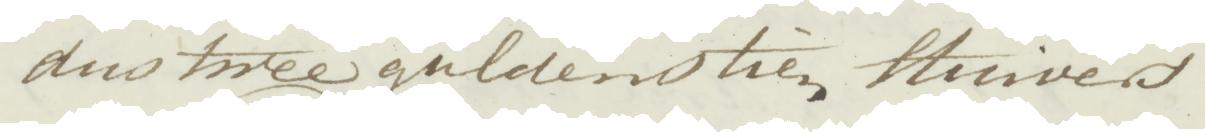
dus twee guldens tien stuivers
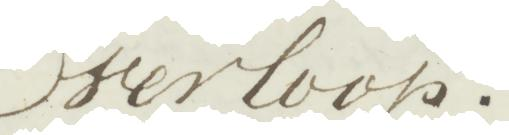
Overloop.
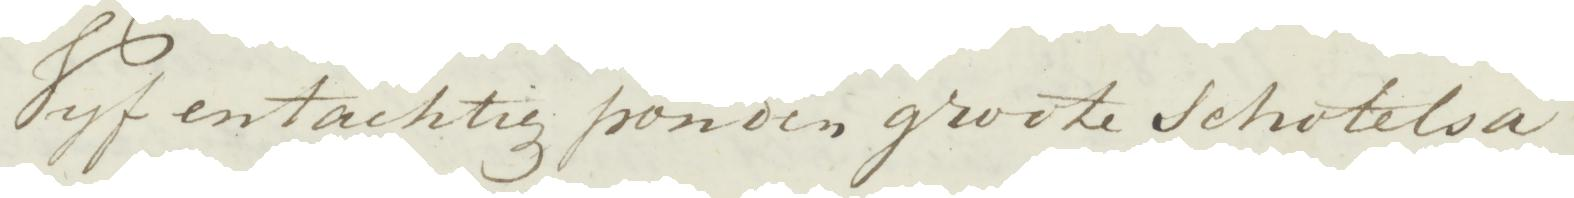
Vyf en tachtig ponden groote schotels a
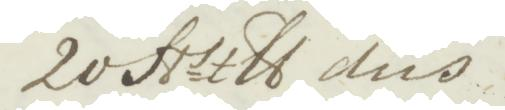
20 st=s t lb dus.
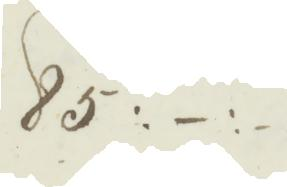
85 : — : -
